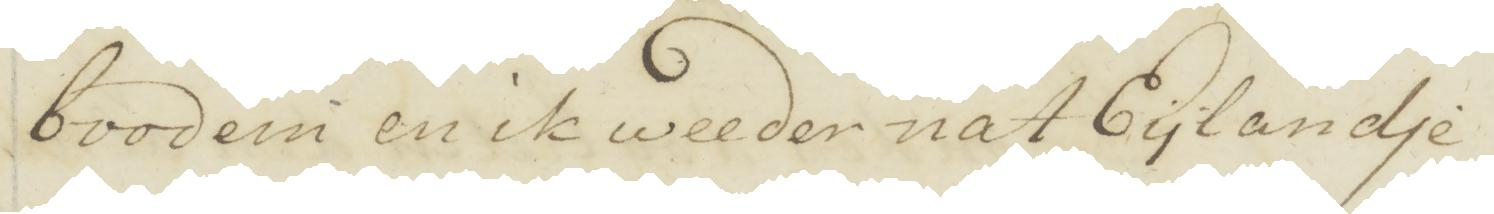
boodem, en ik weeder nat Eijlandje
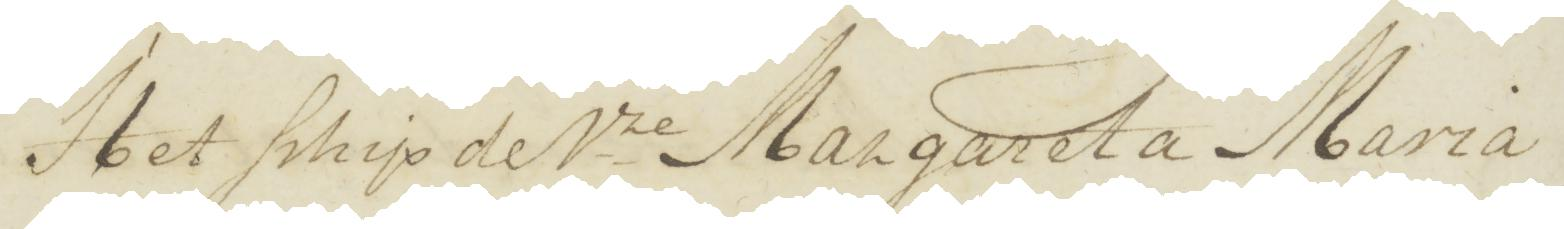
Het schip de V=ze Margareta Maria
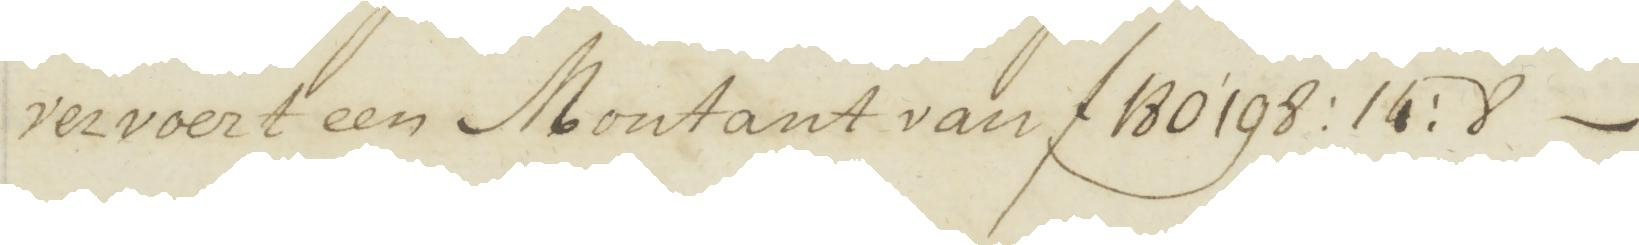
vervoert een Montant van ƒ180'198:14: 8 —
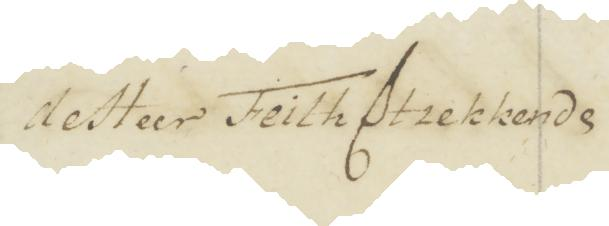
de Heer Feith vertrekken den
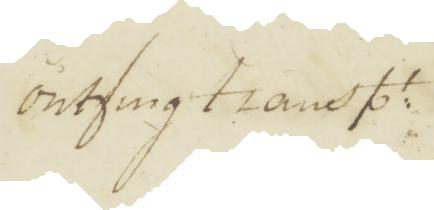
ontfang transp:t
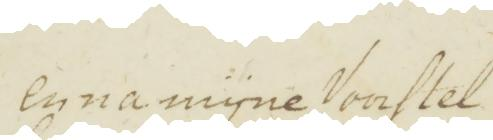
en na mijne Voorstel
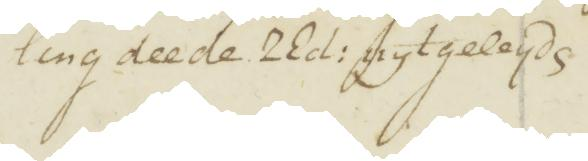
ling deede z Ed: uytgeleyden
